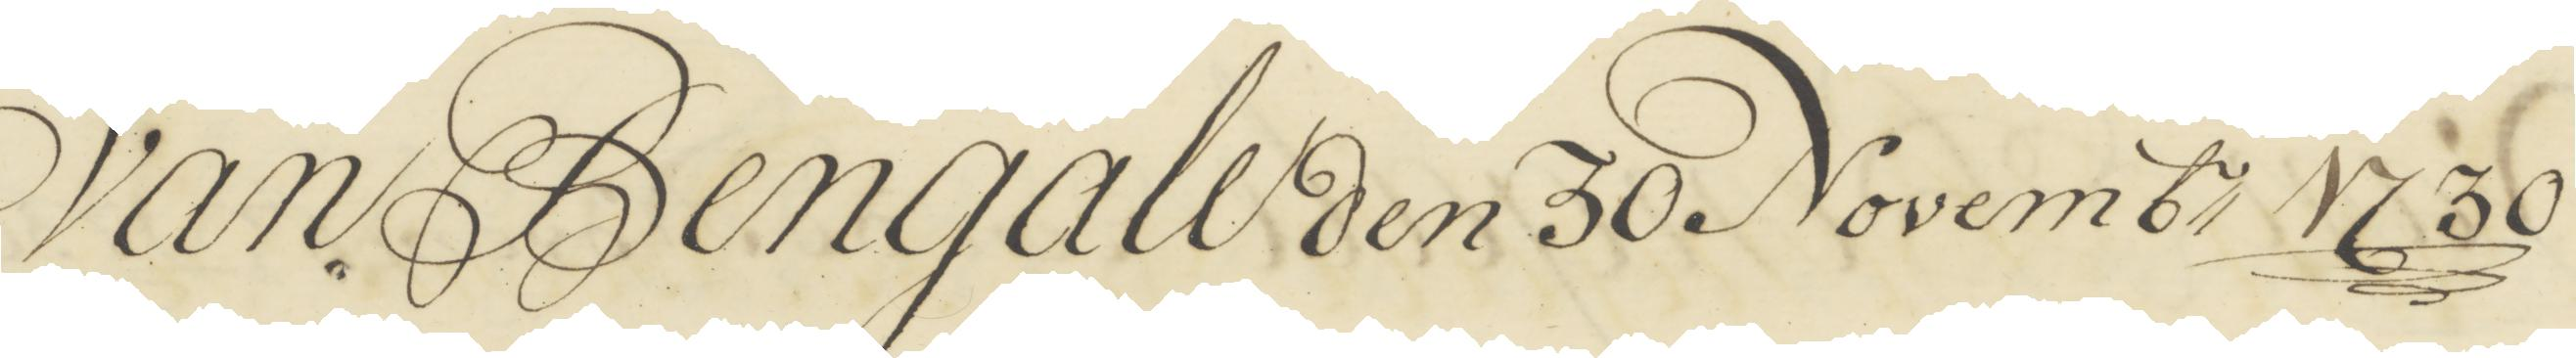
Van Bengale den 30 Novemb„r 1730
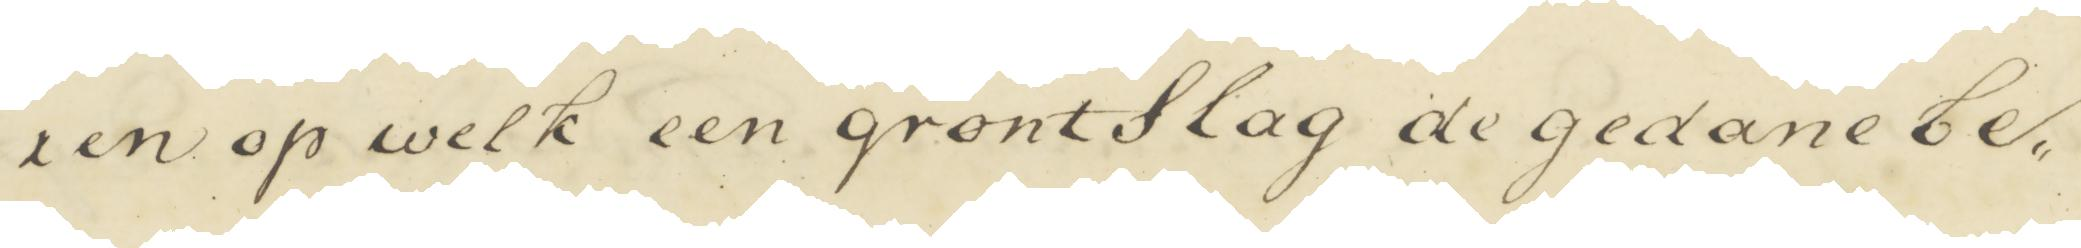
ren op welk een grontslag de gedane be„
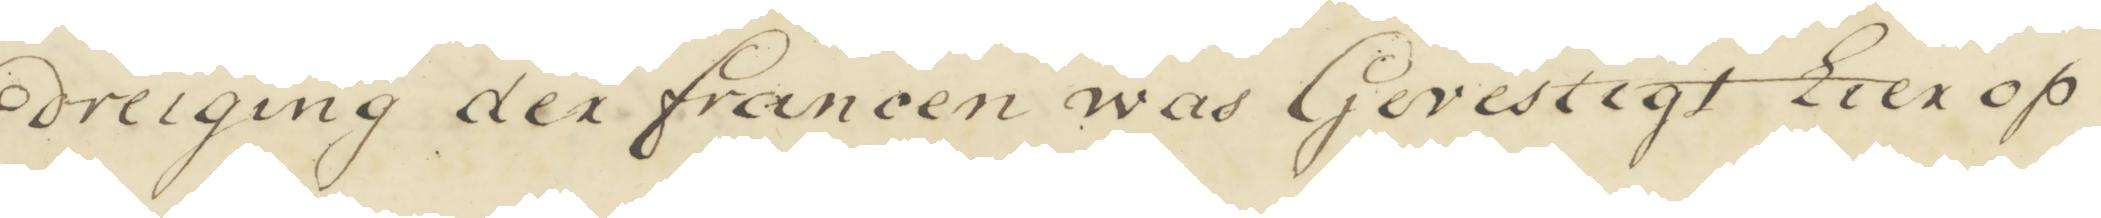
dreiging der francen was Gevestigt hier op
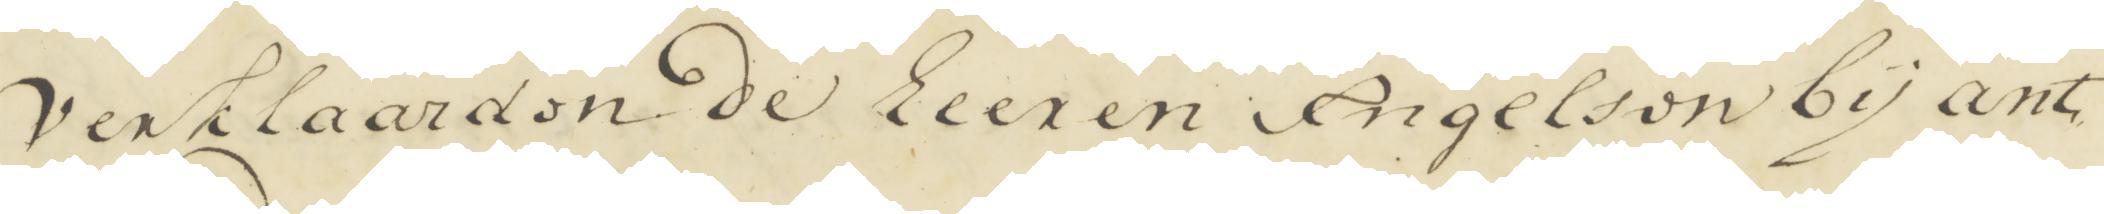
verklaarden de heeren Engelsen bij ant„
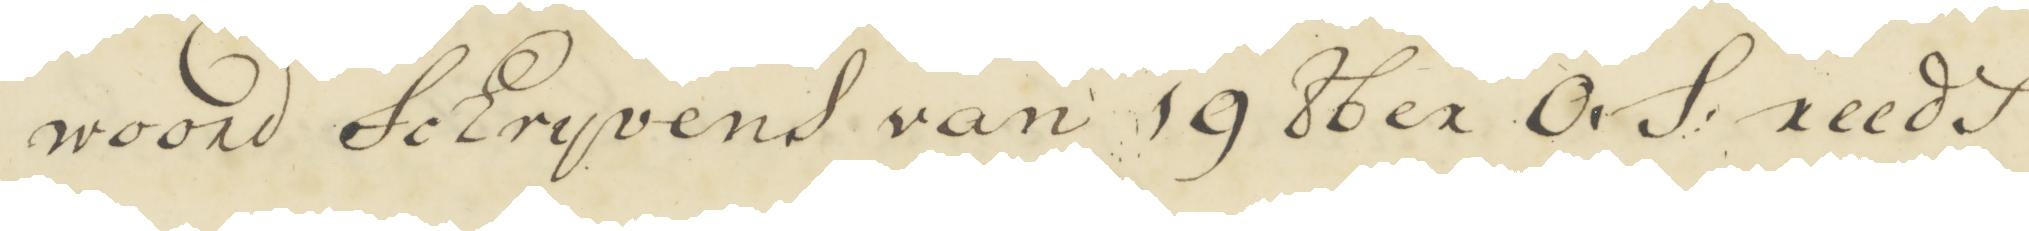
woord schryvens van 19 8ber O.s: reeds
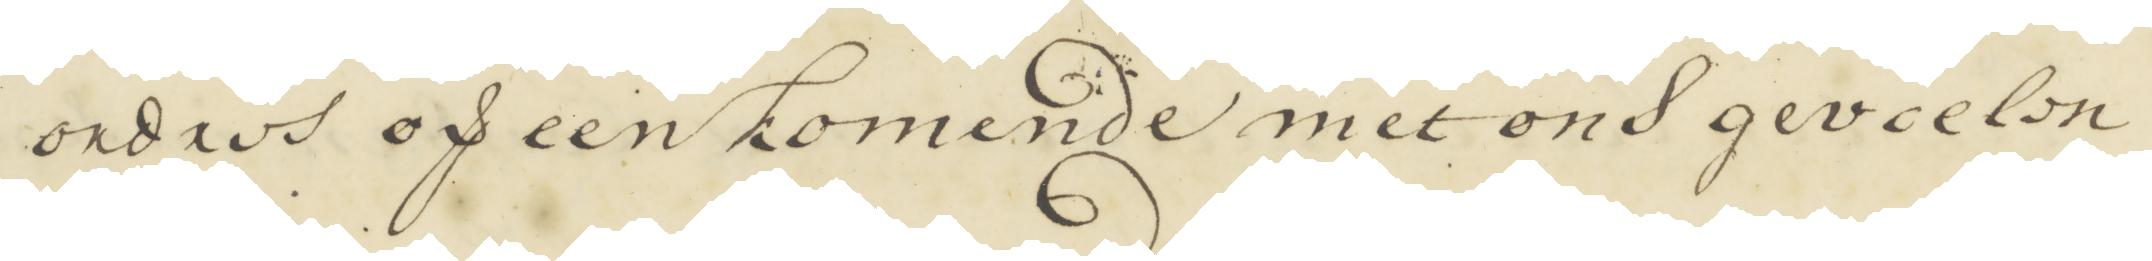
ordres over een komende met ons geveelen
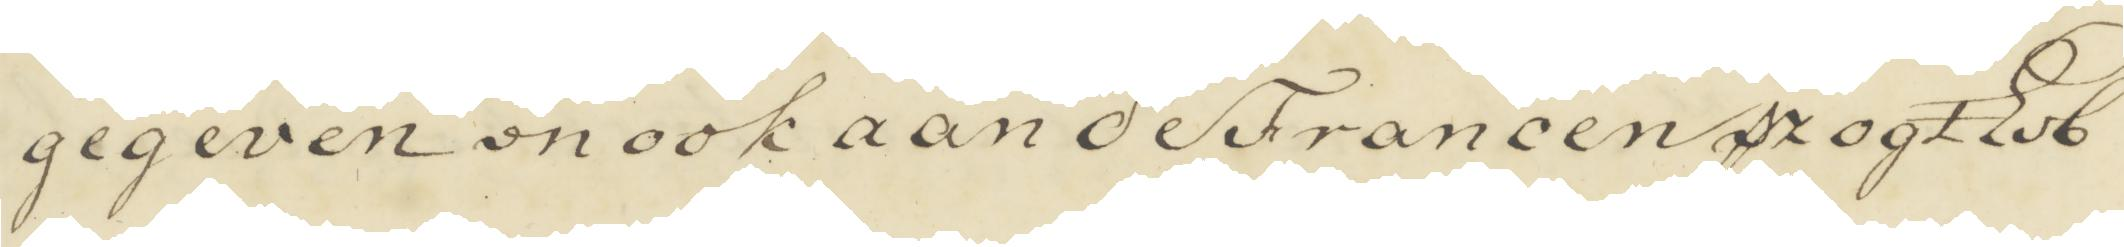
gegeven en ook aan de Francen verzogt heb
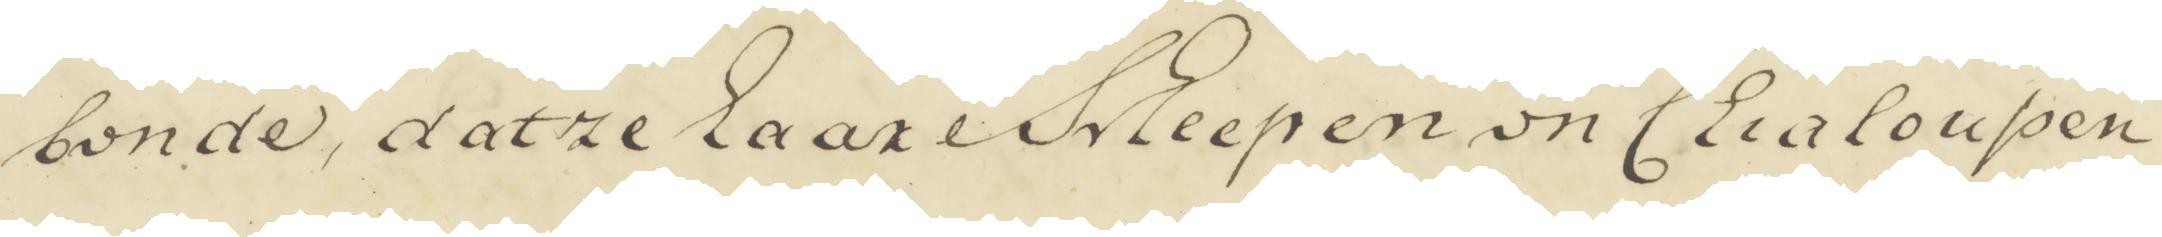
bende, dat ze haare scheepen en chialoupen
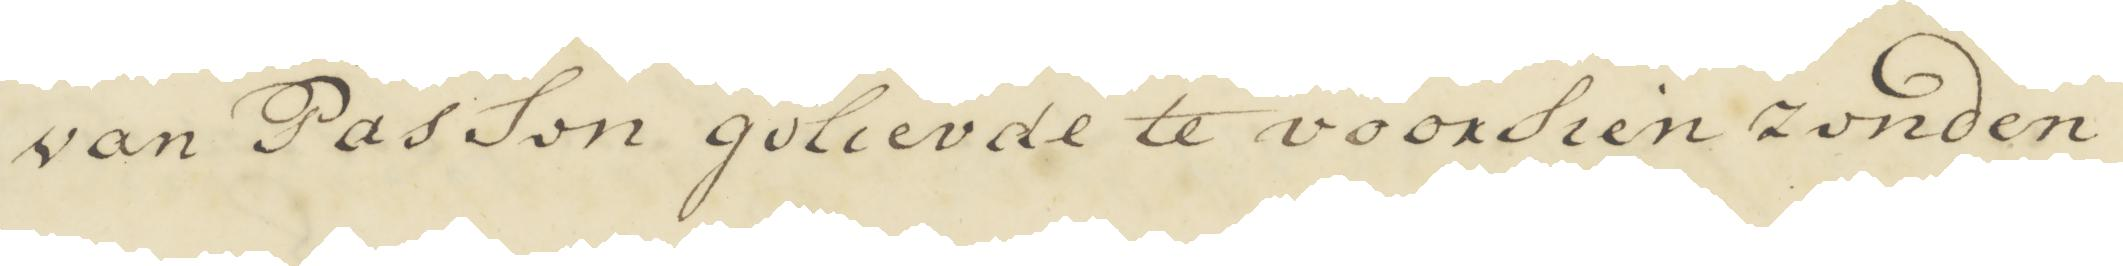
van Passen gelievde te voorsien zenden
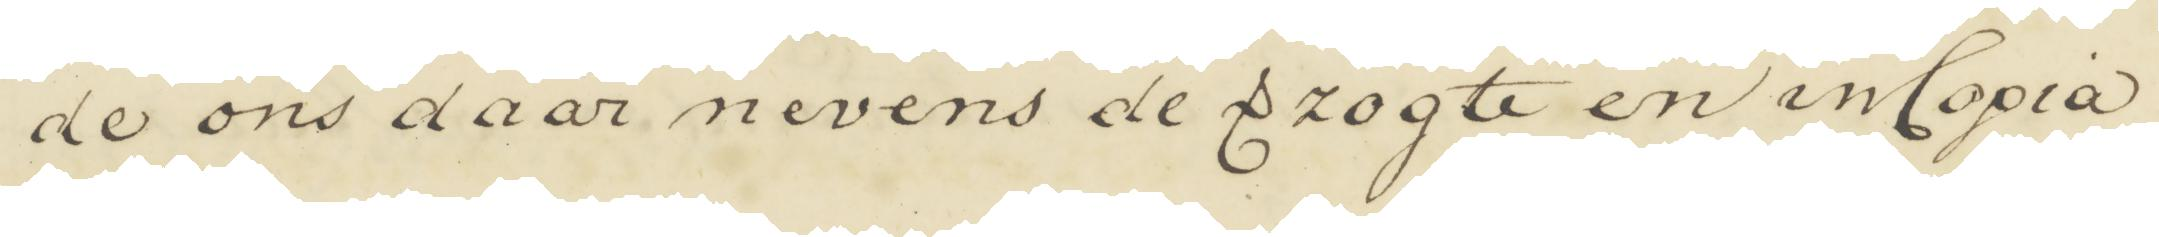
de ons daar nevens de verzogte en in Copia
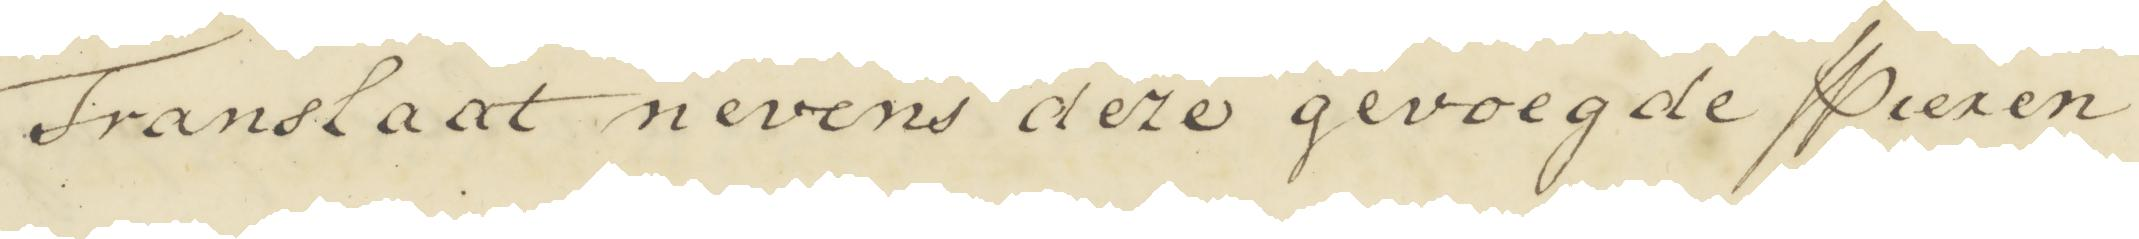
Translaat nevens deze gevoegde ppieren
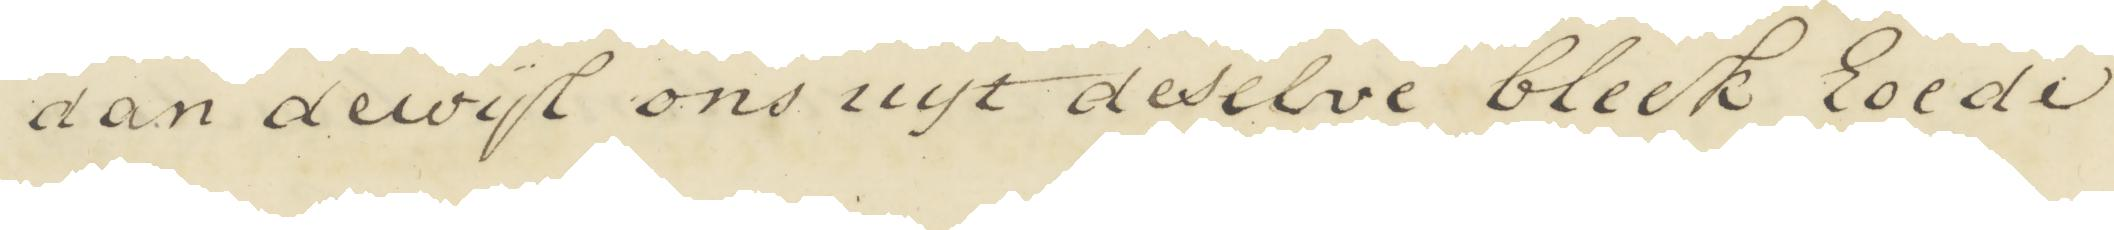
dan dewijl ons uyt deselve bleek hoe de
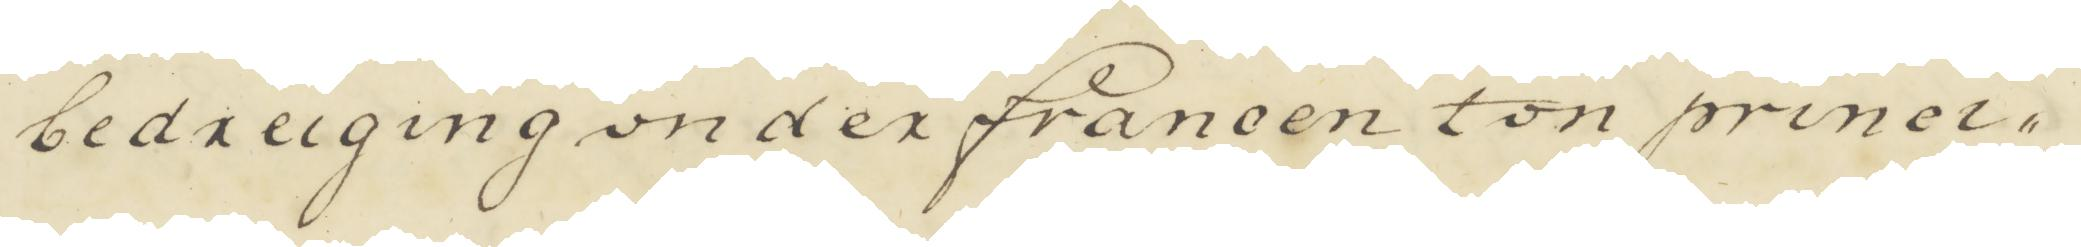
bedreiging en der Francen ten princi„
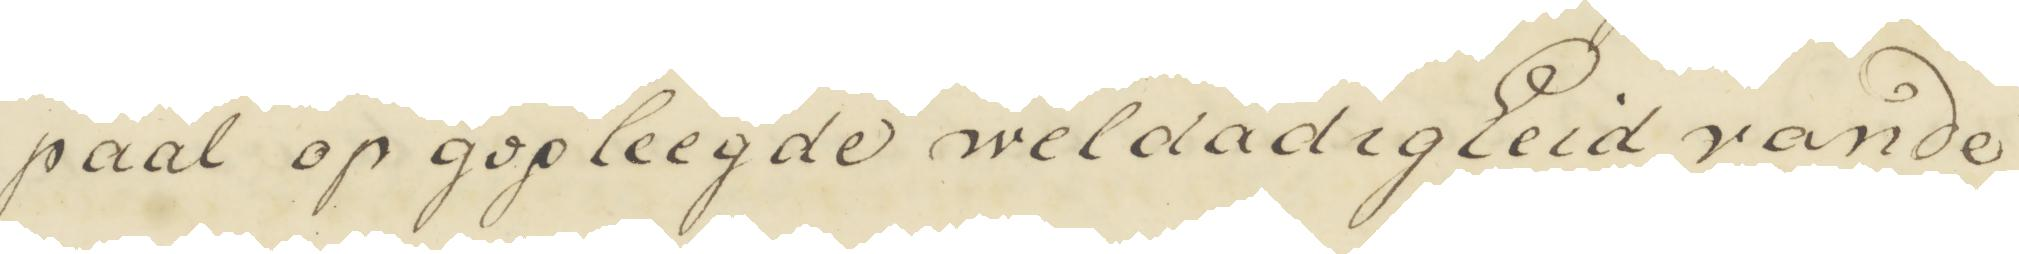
paal op gepleegde weldadigheid van de
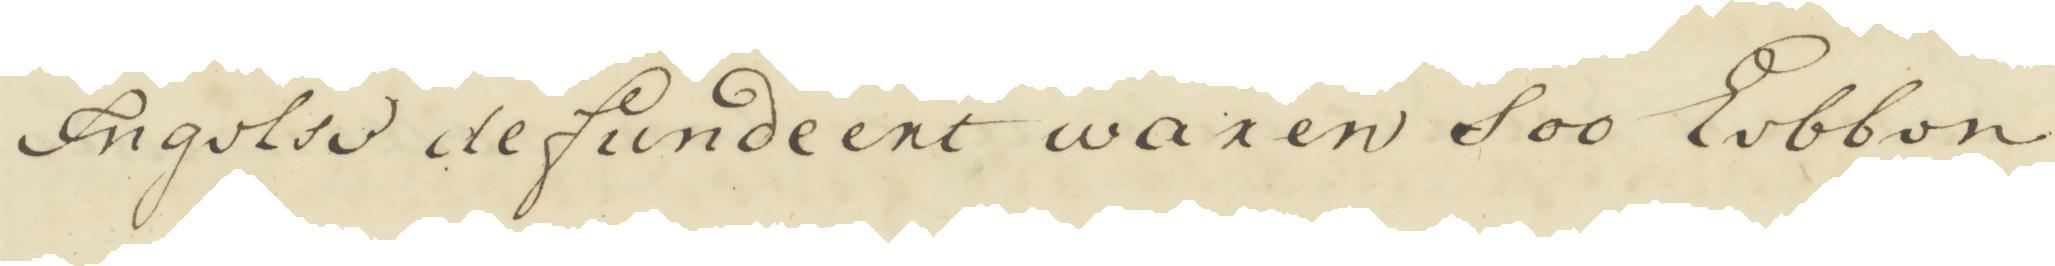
Engelse defundeert waren soo hebben
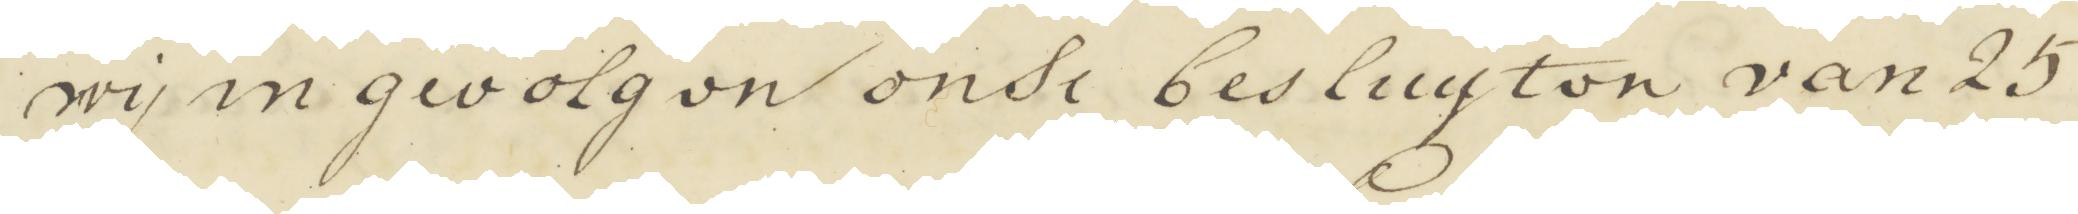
wij in gevolgen onse besluyten van 25
